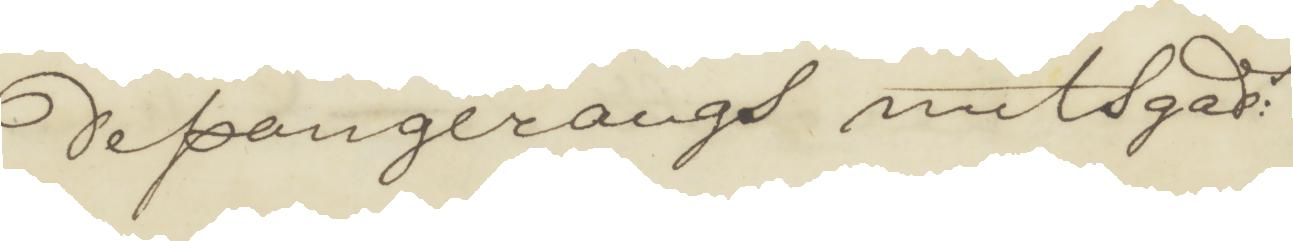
de pangerangs mitsgad:s
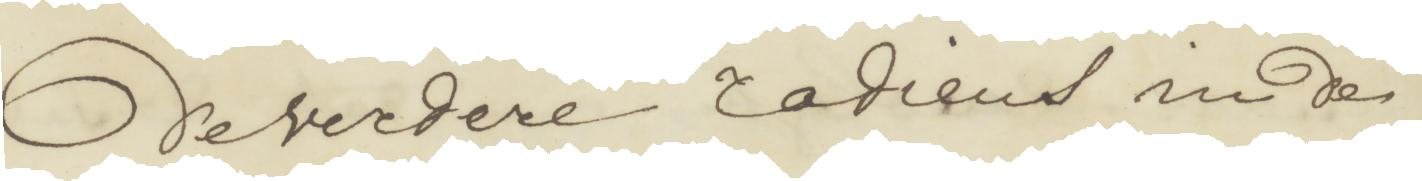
deverdere radiens in de
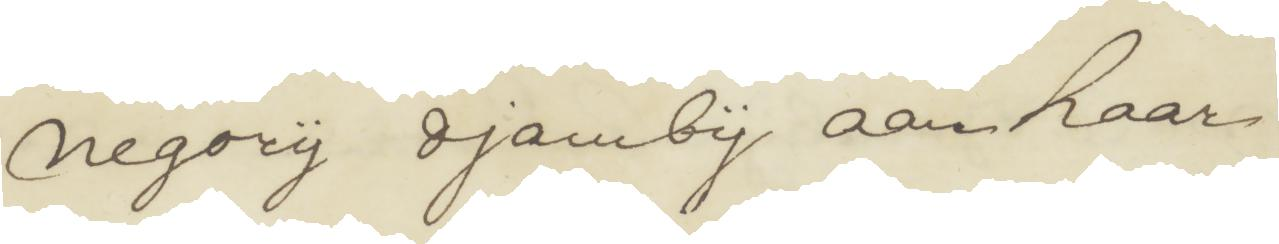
negorij djambij aan haar
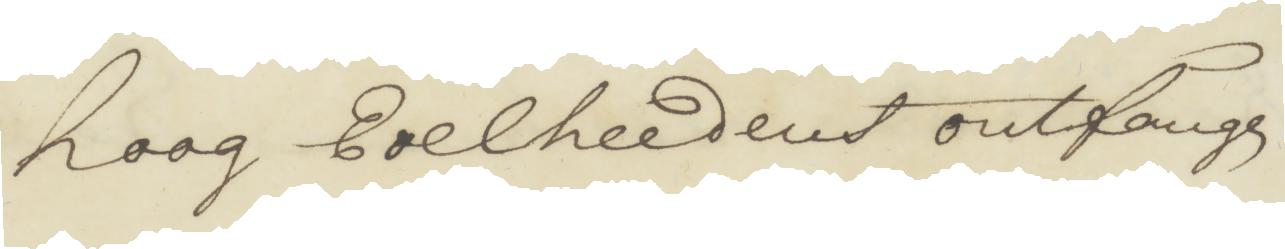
hoog Edelheedens ontfangen
